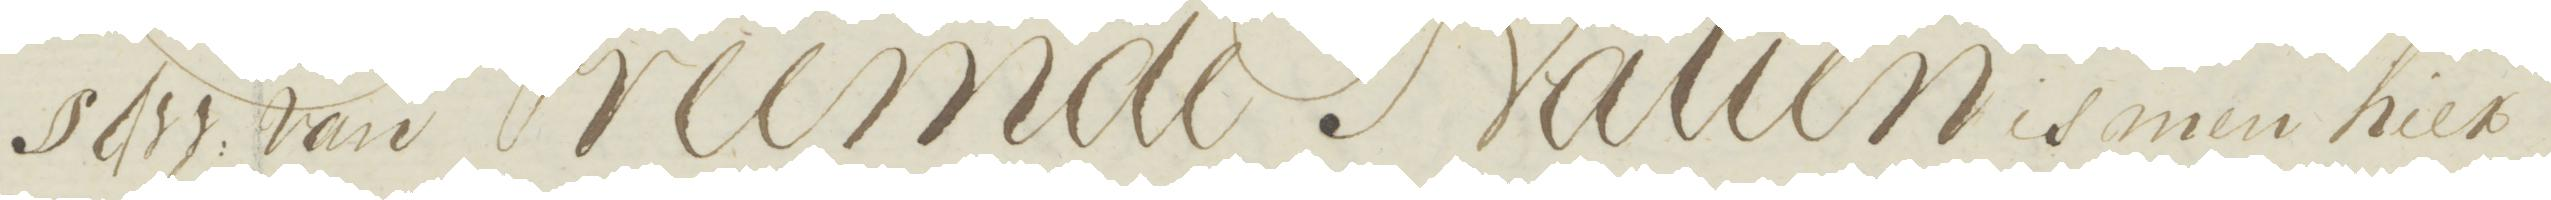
§ 411: van Vreemde Natien is men hier
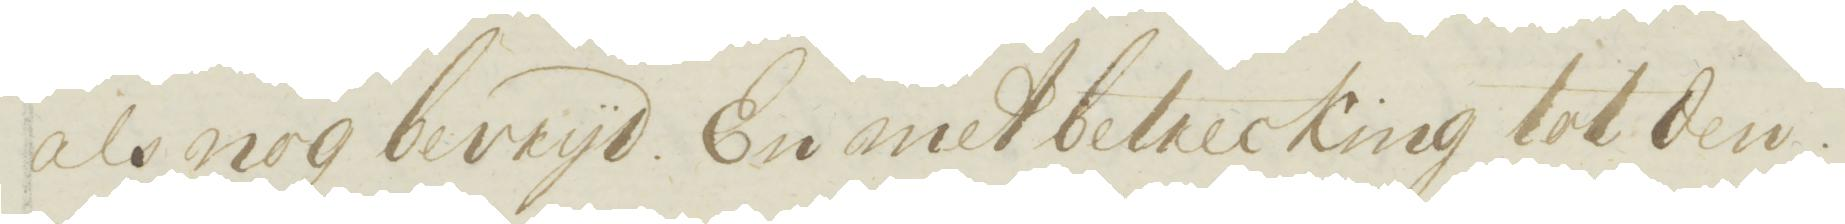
als nog bevrijd. En met betrecking tot den.
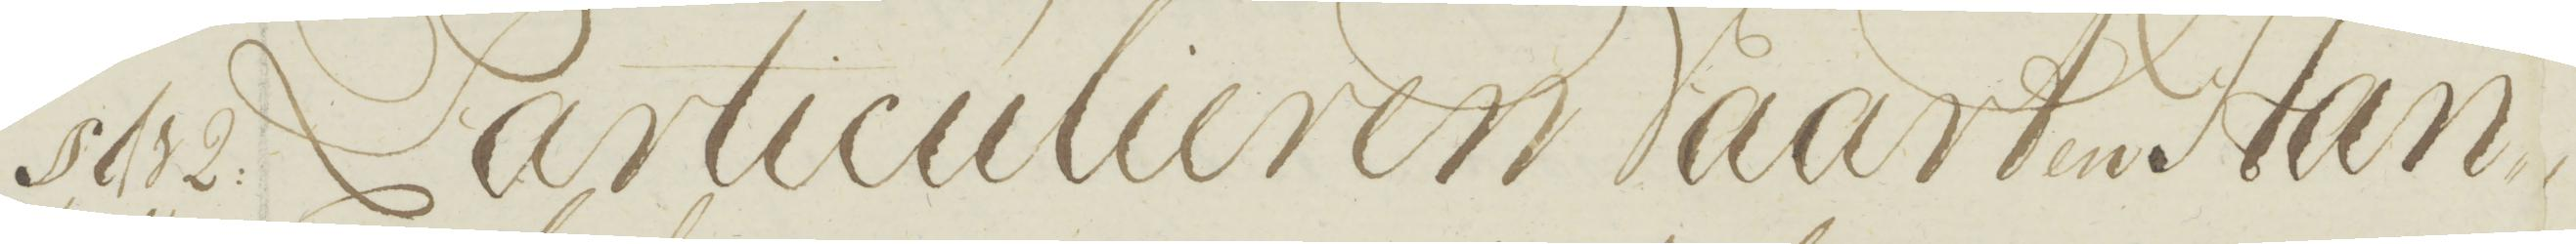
§ 412: Particulieren Vaart ten Han„
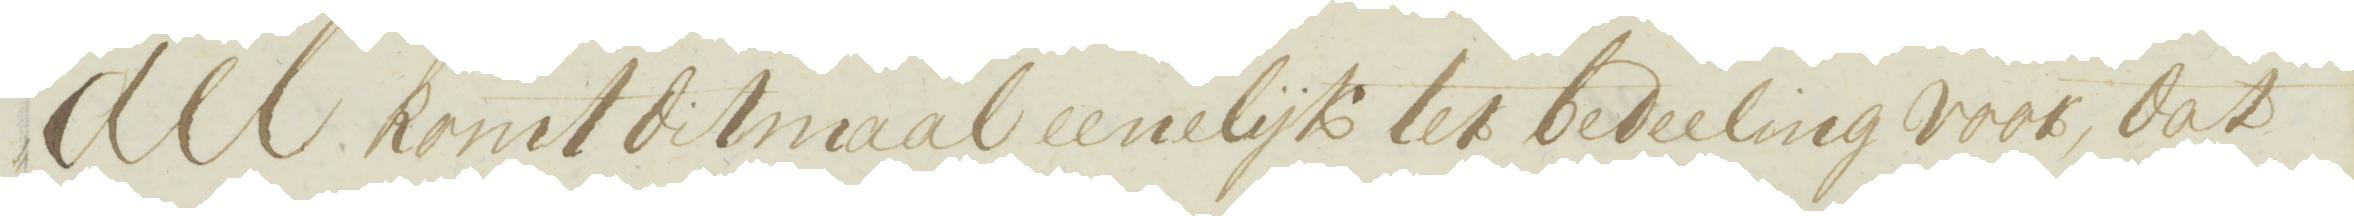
del komt ditmaal eenelijk ter bedeeling voor, dat
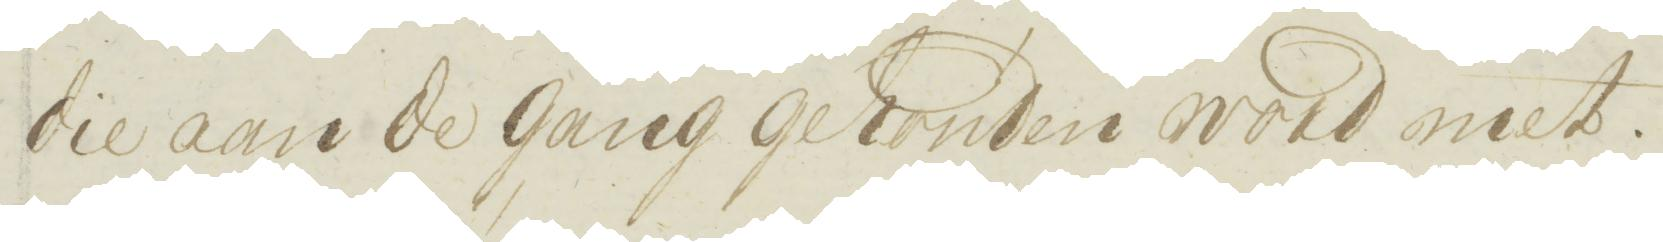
die aan de gang gehouden word met.
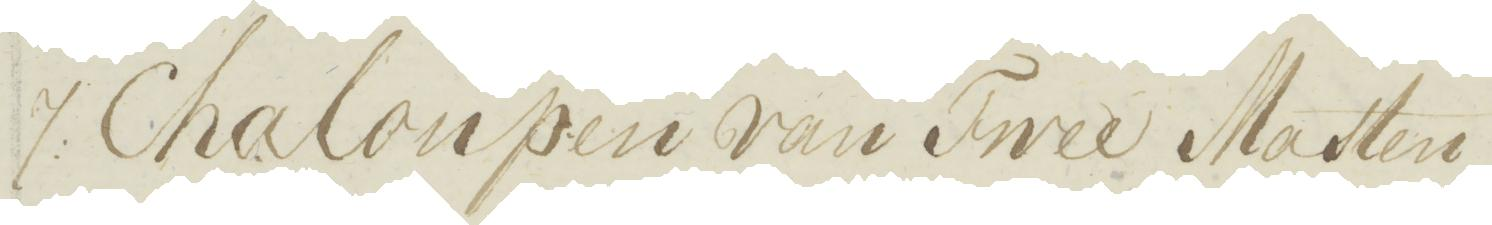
7: Chaloupen van Twee Masten
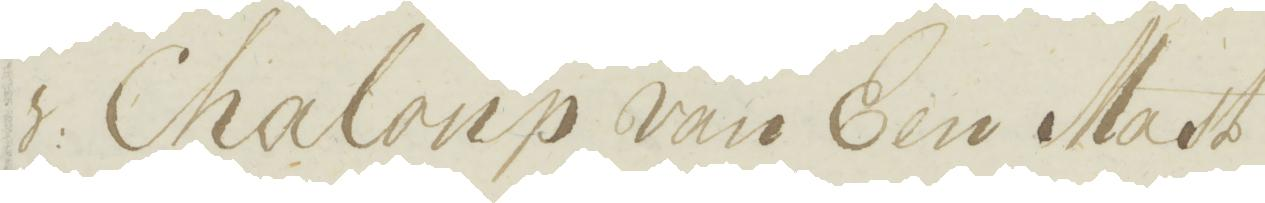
1: Chaloup van Een Mast
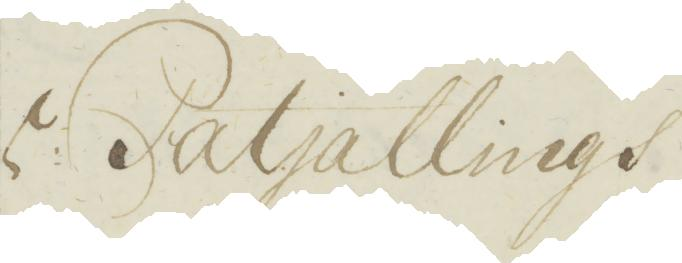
5: Patjallings
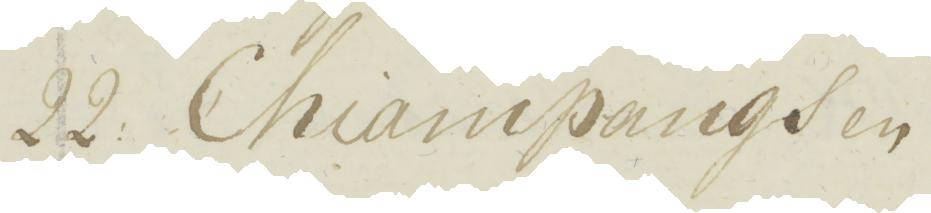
22: Chiampangs en
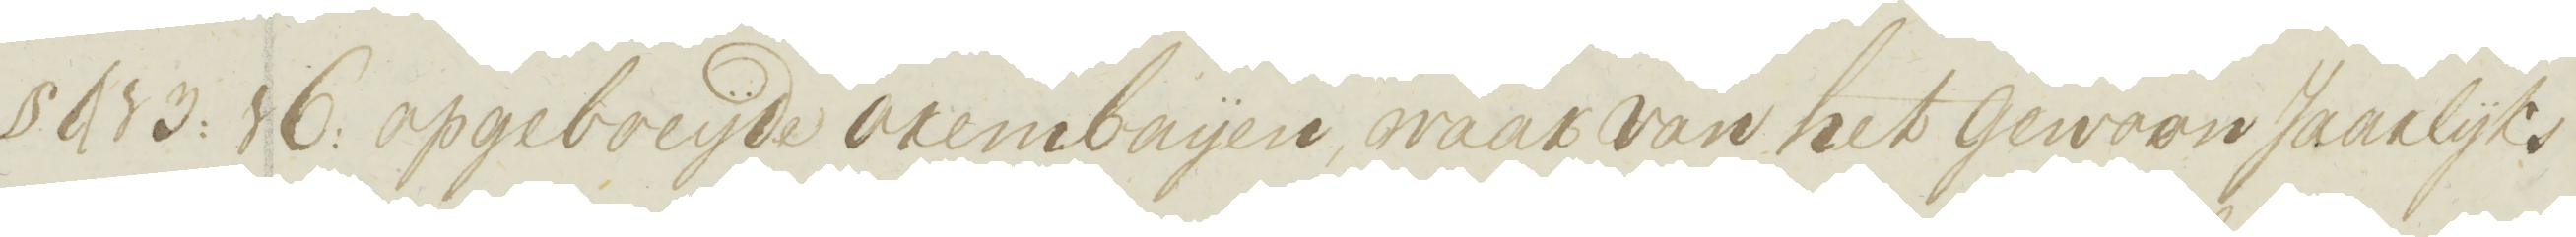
§ 413: 16: opgeboeijde orembaijen, waar van het gewoon Jaarlijks
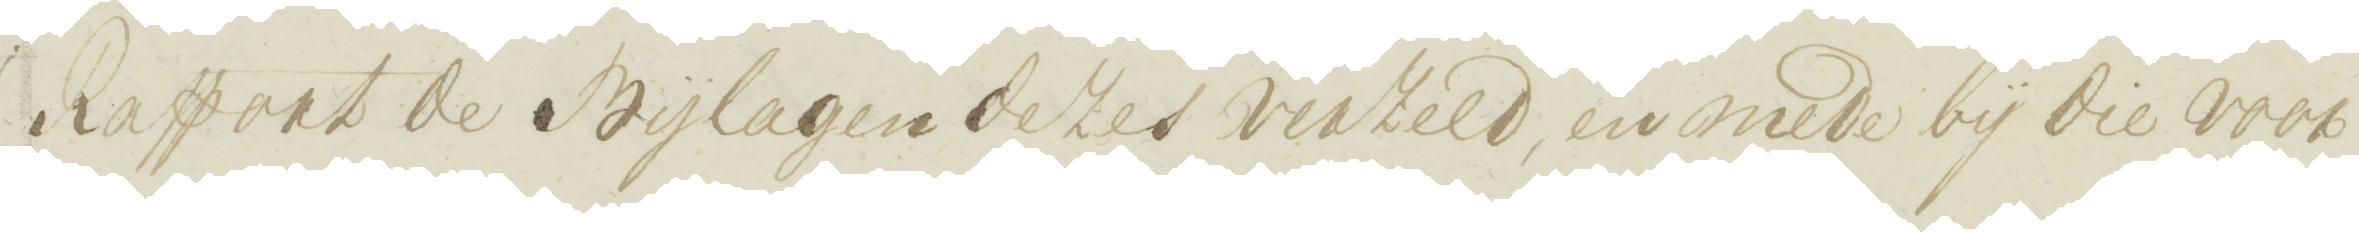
Rapport de Bijlagen dezes verzeld, en mede bij die voor
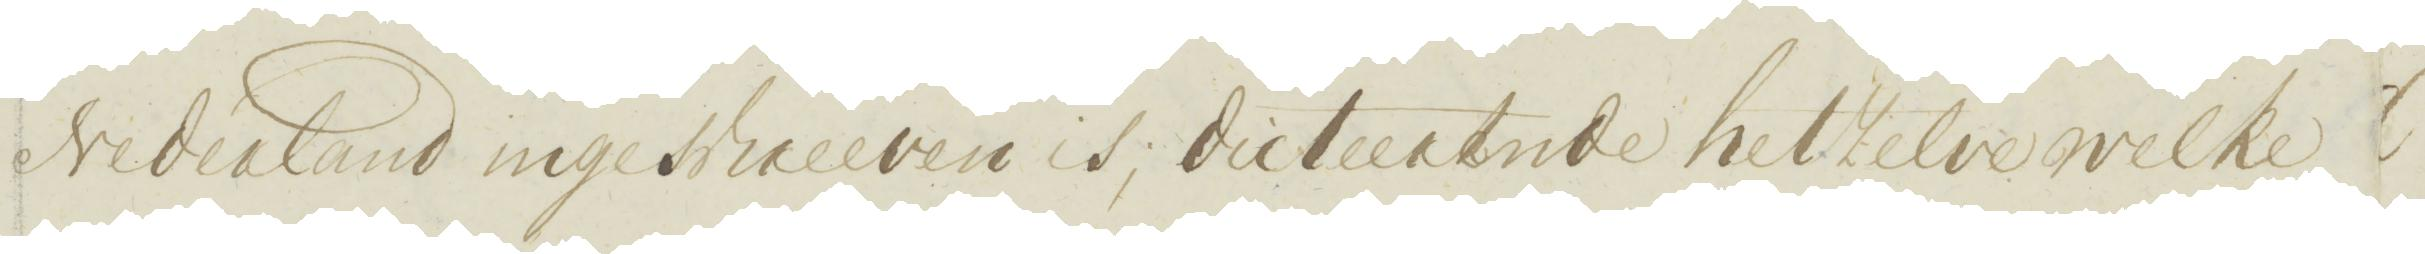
Nederland ingeschreeven is; dicteerende hetzelve welke
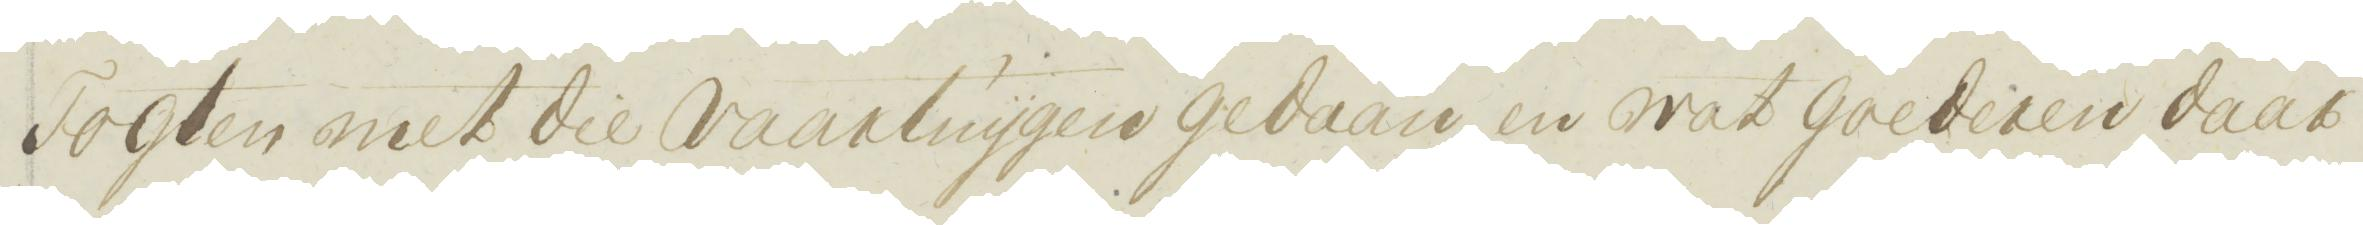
Togten met die vaartuijgen gedaan, en wat goederen daar
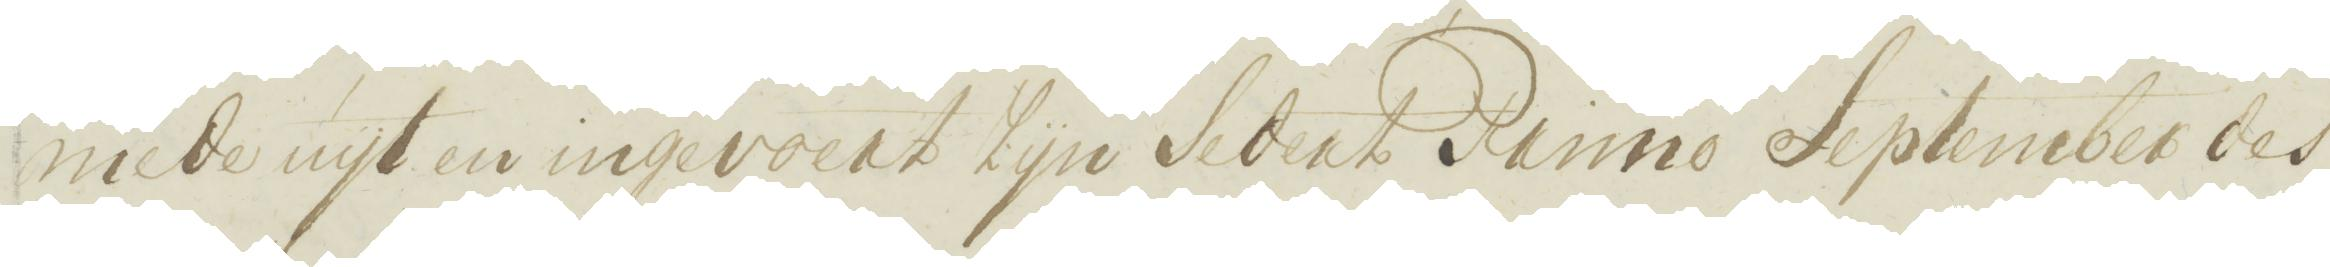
mede uijt en ingevoert zijn sedert Primo September des
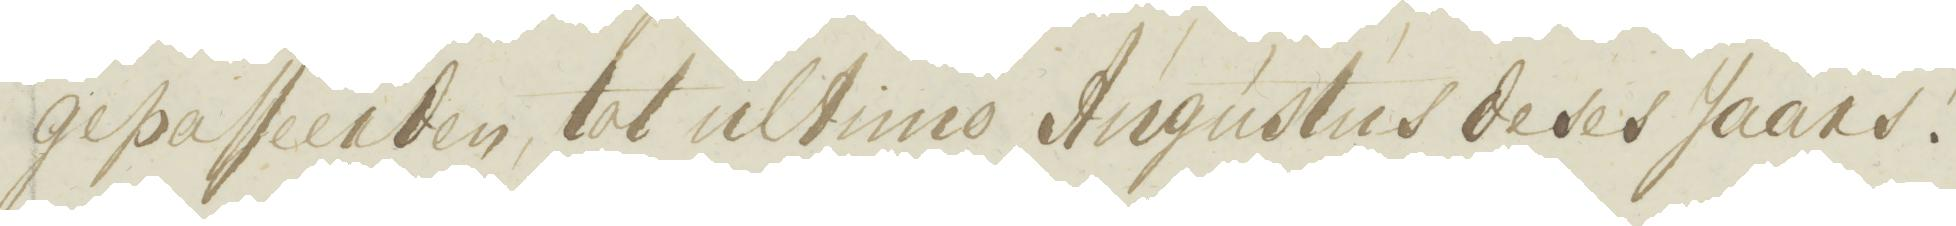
gepasseerden, tot ultimo Augustus deses Jaars.
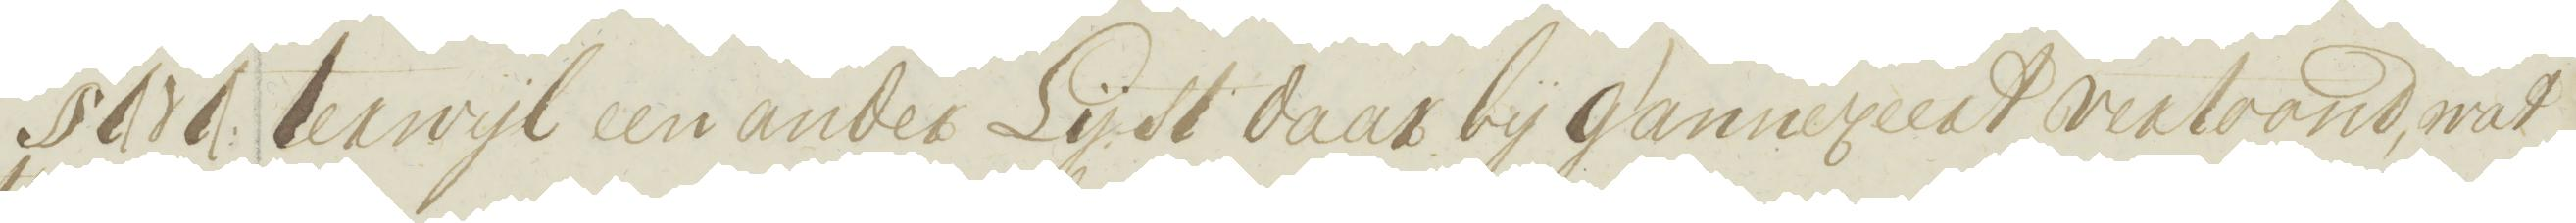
§ 414: terwijl een ander Lijst daar bij g'annexeert vertoond, wat
